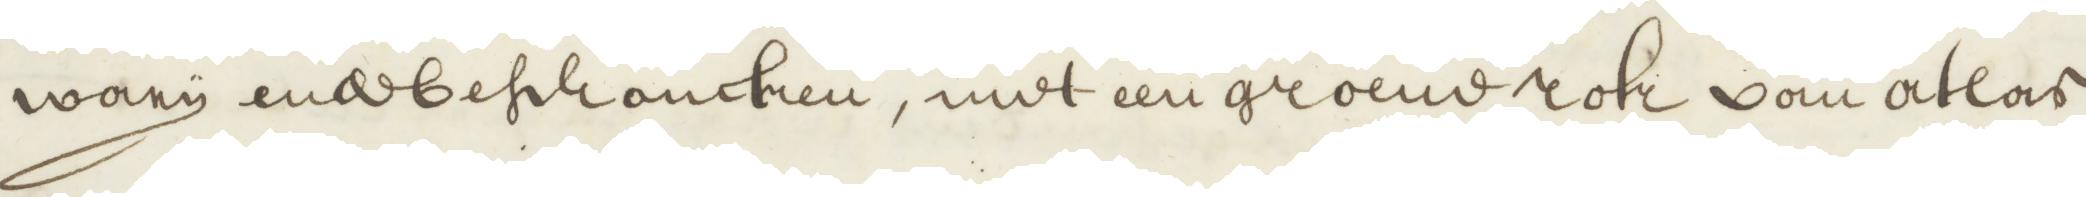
warij endebeschoncken, met een groene rok van atlas
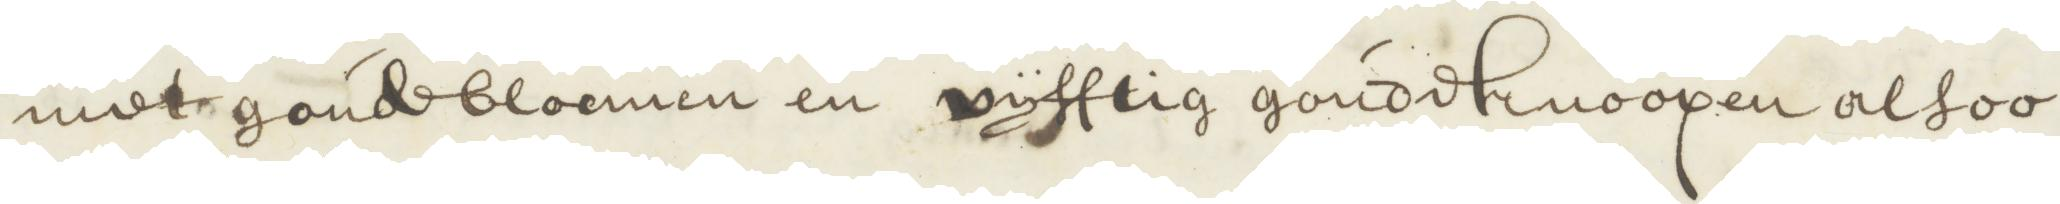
met goudebloemen en vijfftig goudeknoopen alsoo
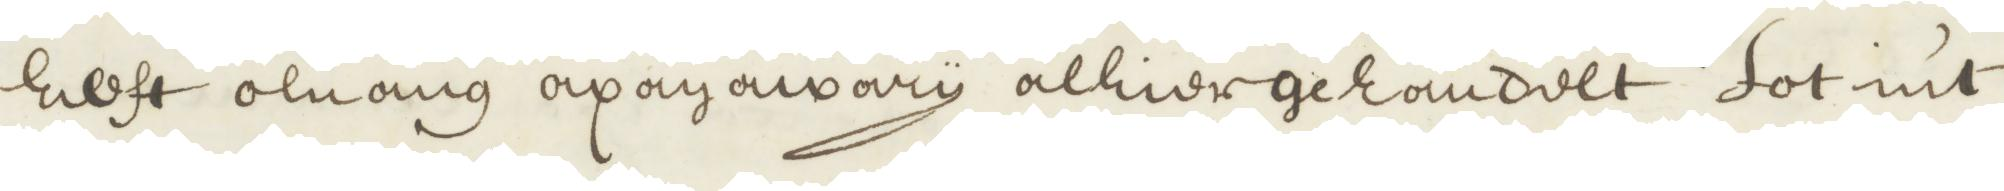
heeft oluang apayawarij alhier gehandelt tot in't
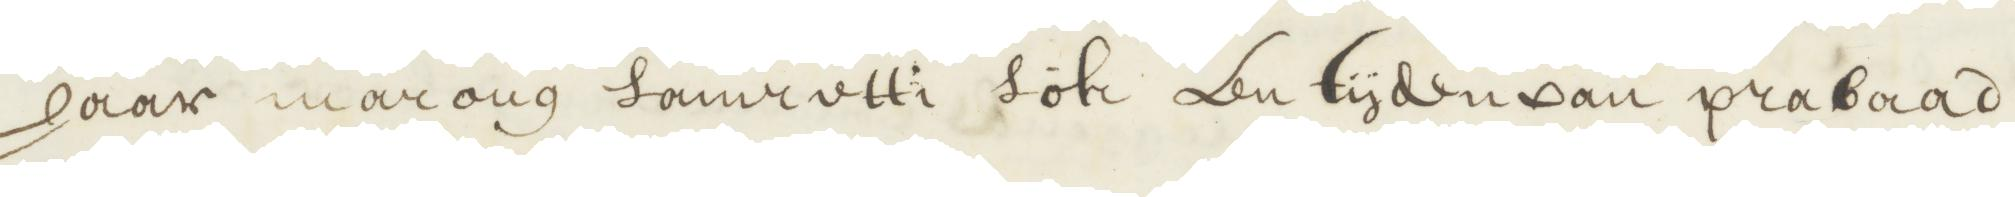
Jaar marong Samretti sok ten tijden van prabaad
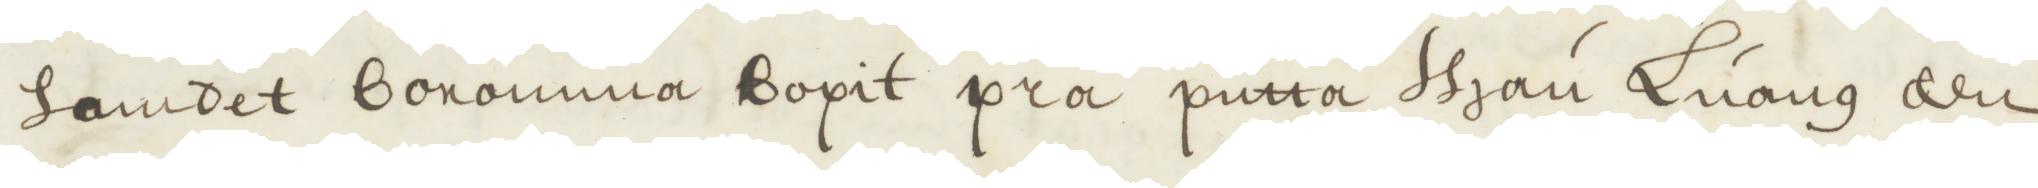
somdet boromma bopit pra putta thjan Luang den
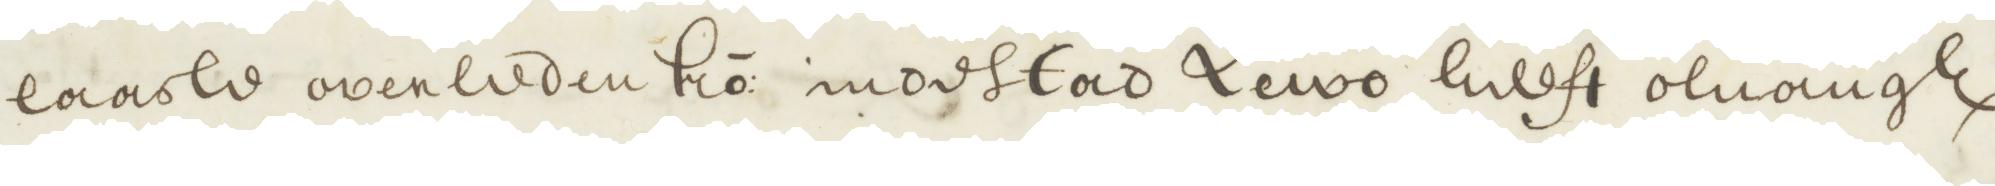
laaste overleden ko: moestad Lewo heeft oluangh
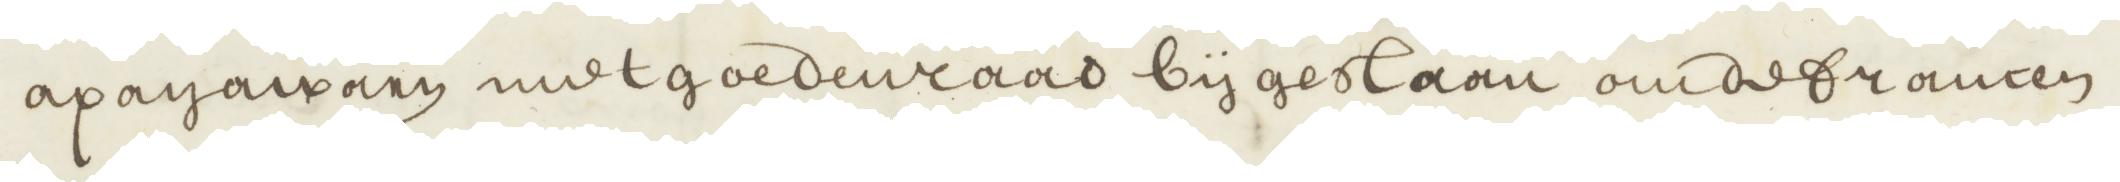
apayawarij met goeden raad bij gestaan om de francen
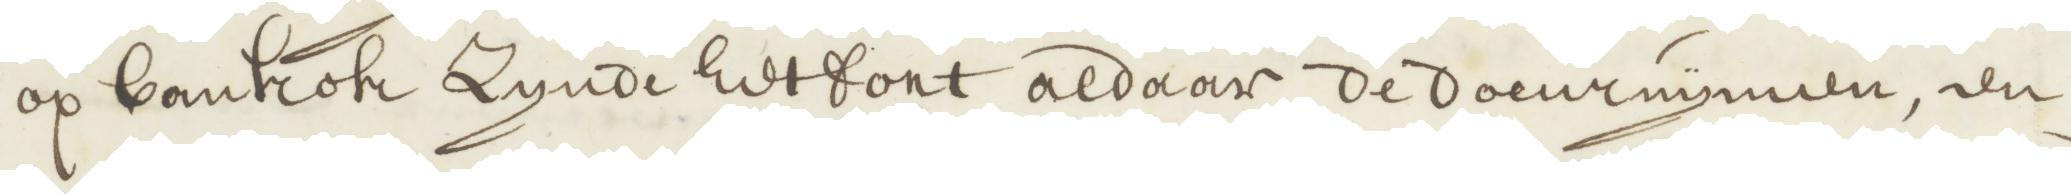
op bankok Zynde het fort aldaar de doenruijmen, en
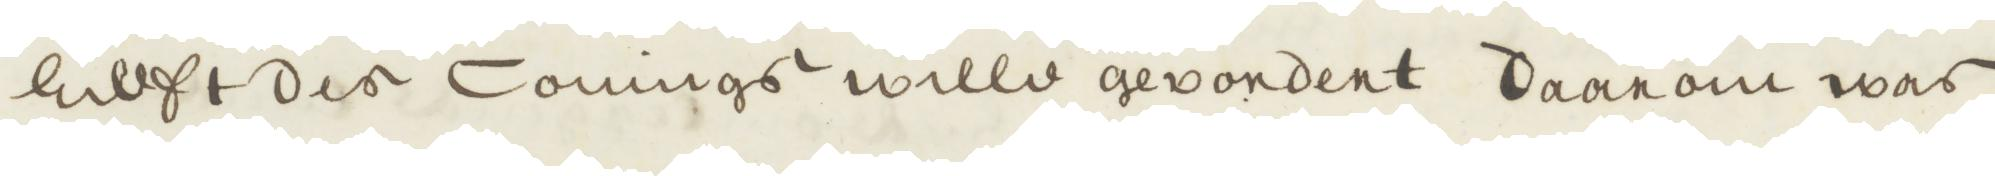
heeft des conings wille gevordert daarom was
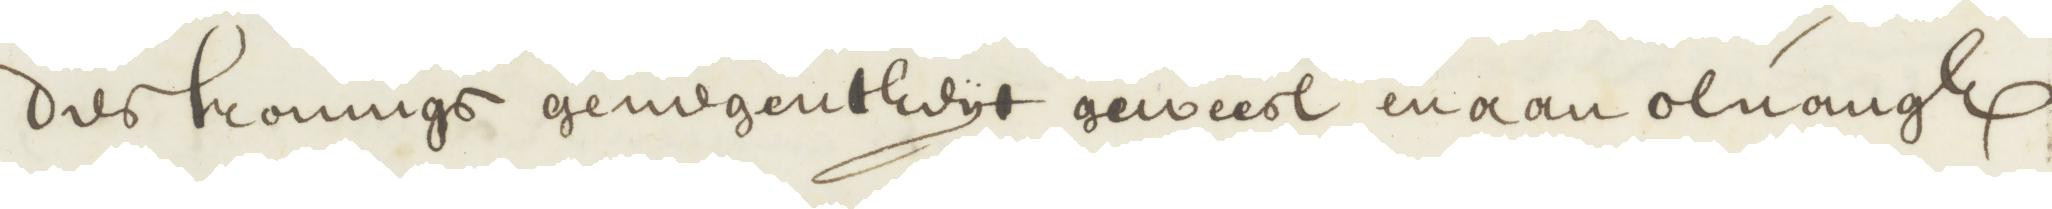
des konings genegentheijt geweest en aan oluangh
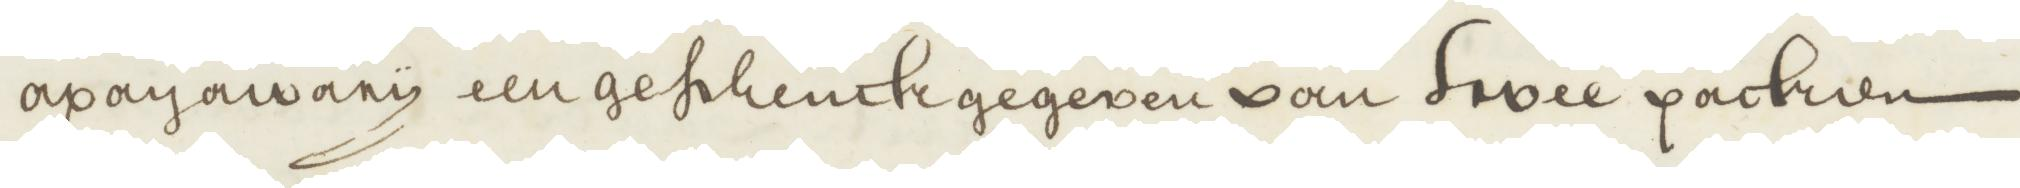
apayawarij een geschenck gegeven van twee packen
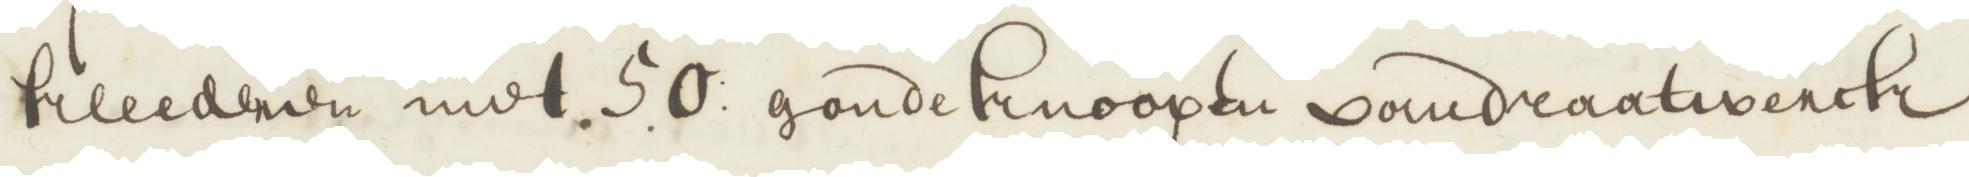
kleederen met 50: goude knoopen vandraatwerck
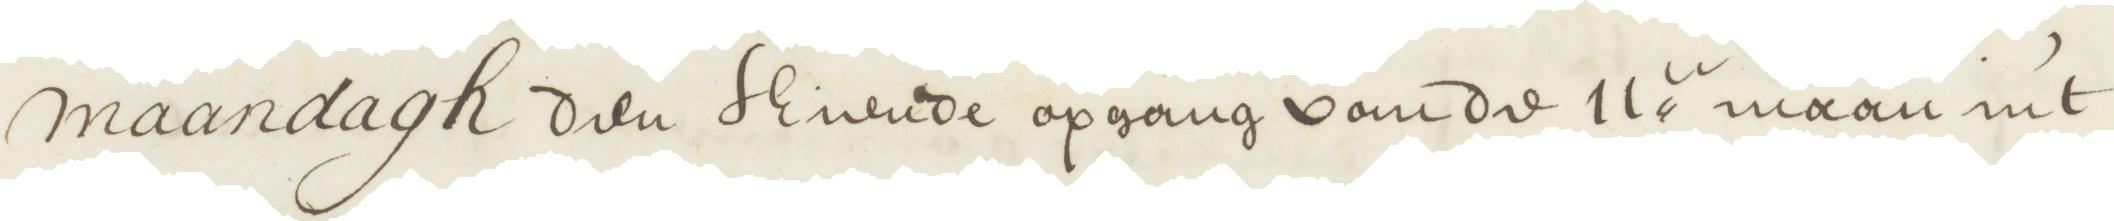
maandagh den thiende op gang van de 11„'' maan in’t
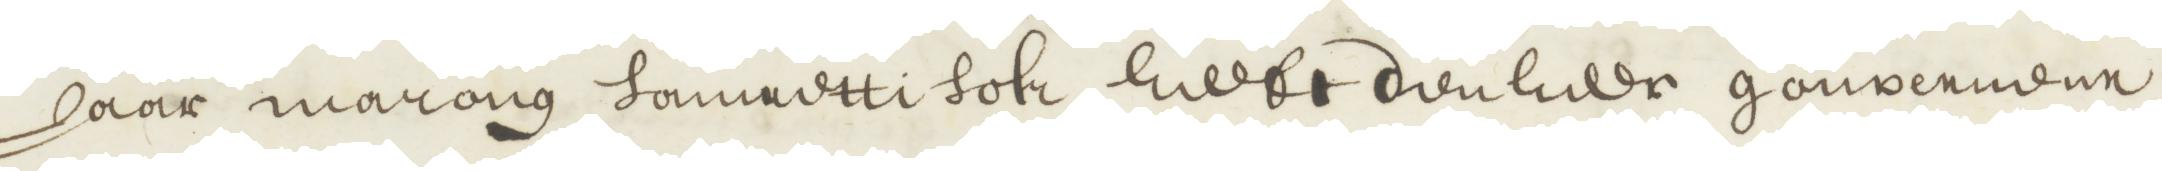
Jaar marong samretti sok, heeft den heer gouverneur
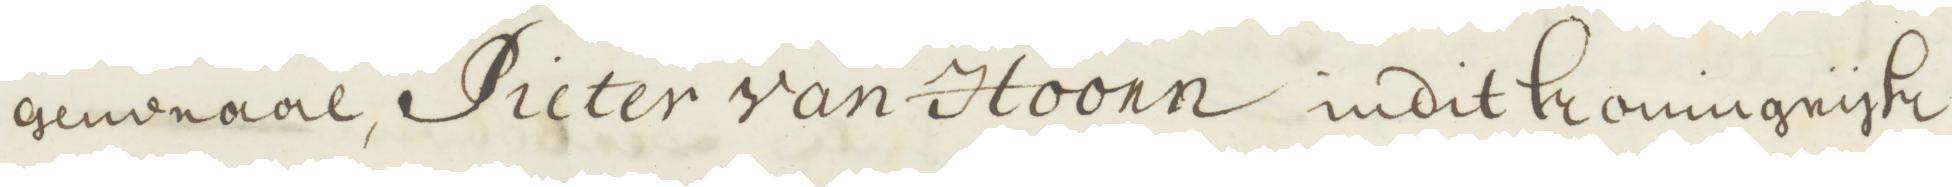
generaal, Pieter van Hoorn in dit koningrijk
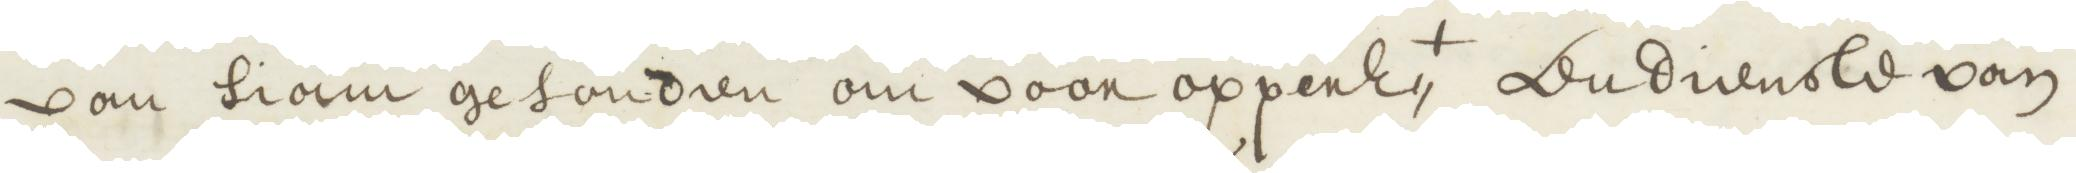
van siam gesonden om voor opperh„t ten dienste van
